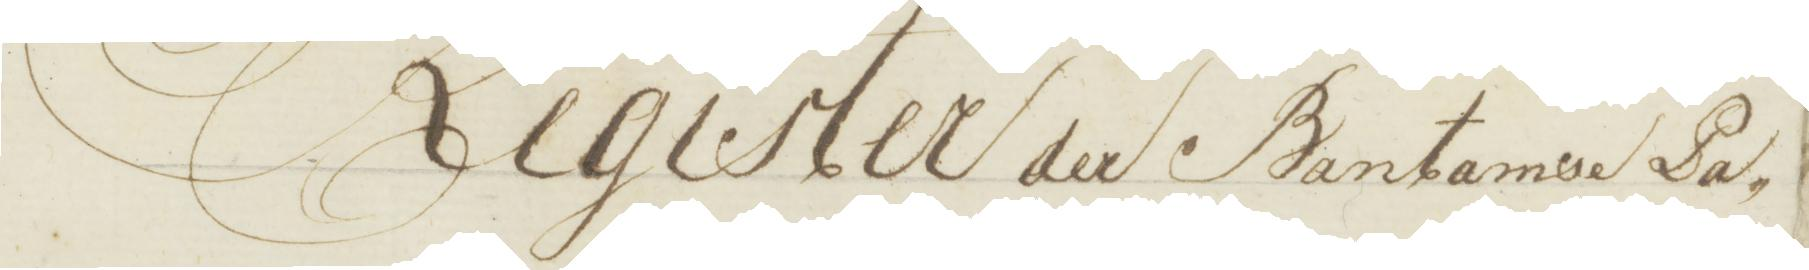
Register der Bantamse Pa„
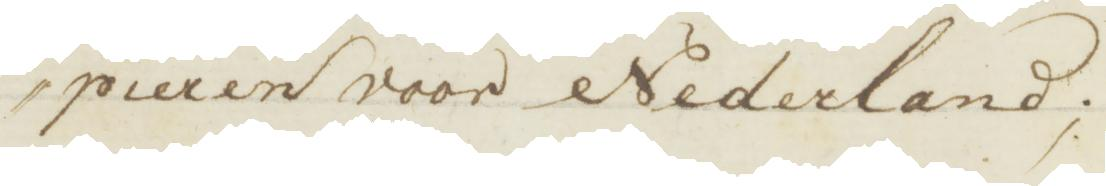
„pieren voor Nederland.
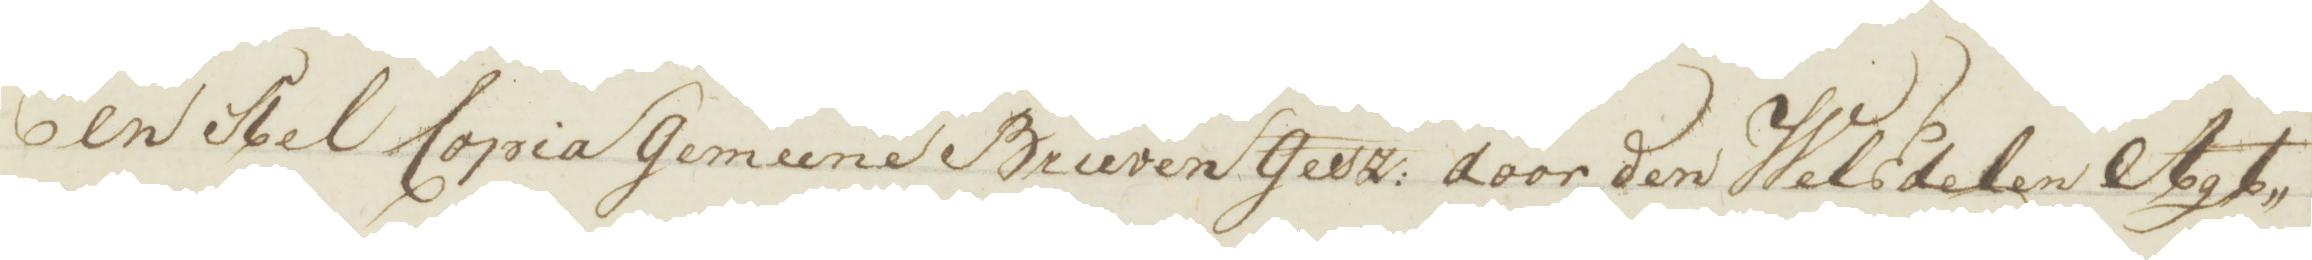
Een stel Copia Gemeene Brieven Gesz: door den Wel Edelen Agt„
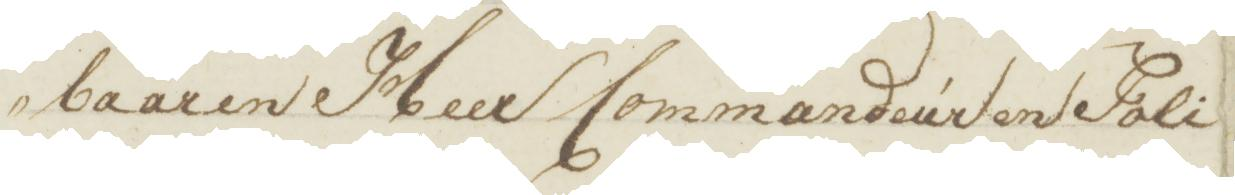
„baaren Heer Commandeur en Poli
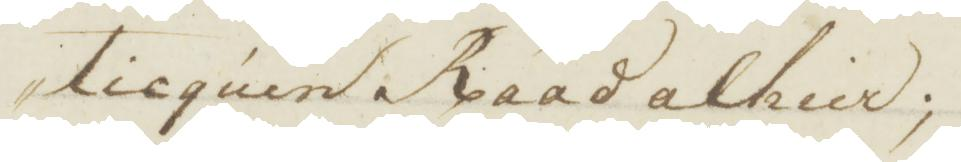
„ticquen Raad alhier;
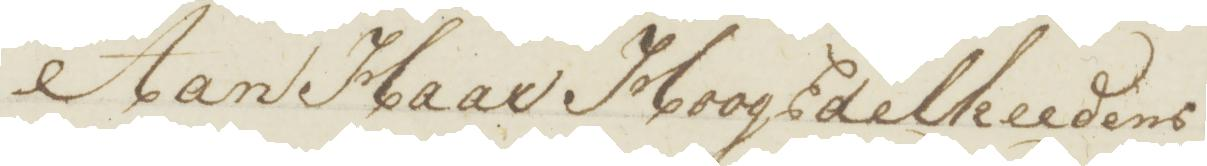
Aan Haar Hoog Edelheedens
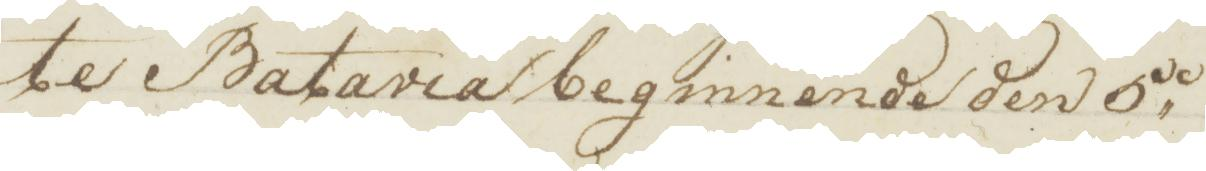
te Batavia beginnende den 5„e
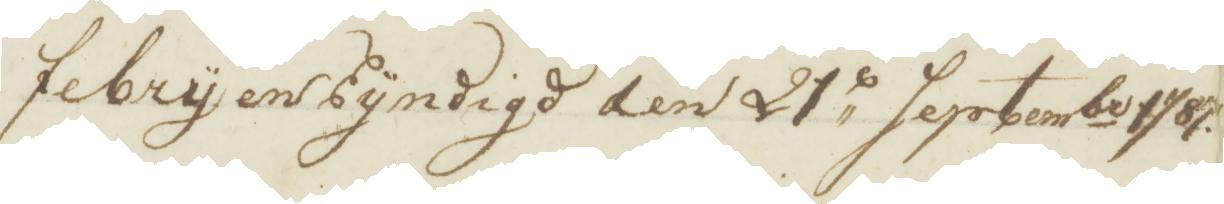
febrij en Eijndigd den 21„e Septem:br 1787.
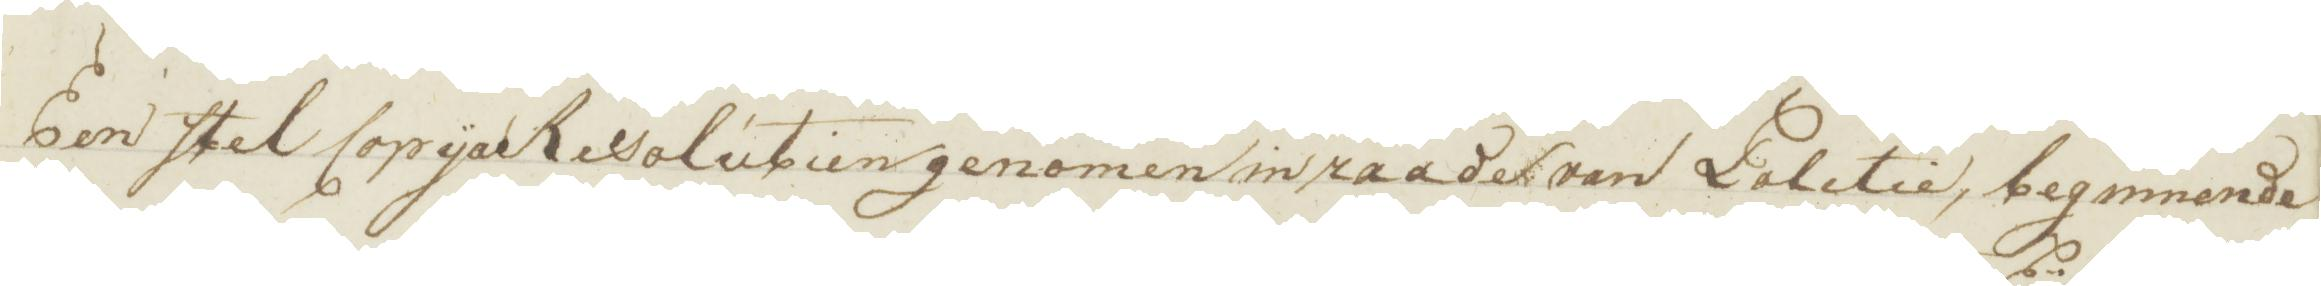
Een stel Copija Resolutien genomen in raade van Politie, beginnende
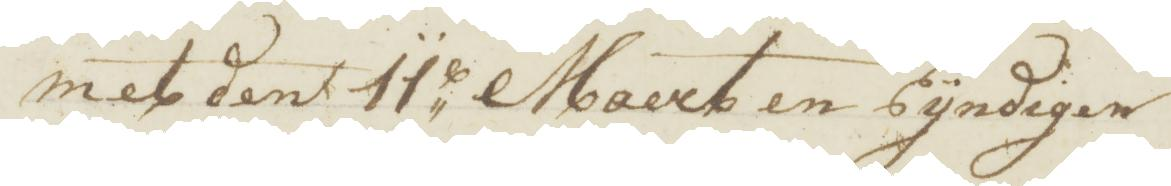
met den 11„e Maert en Eijndigen
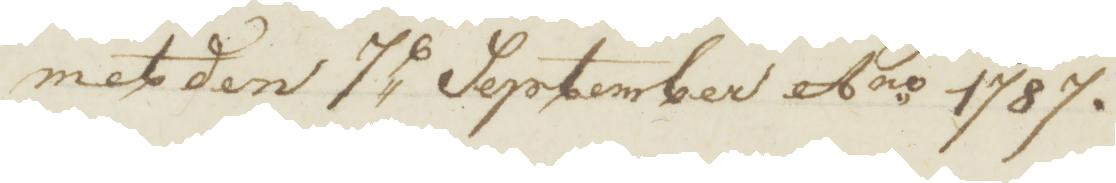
met den 7„e September A„no 1787..
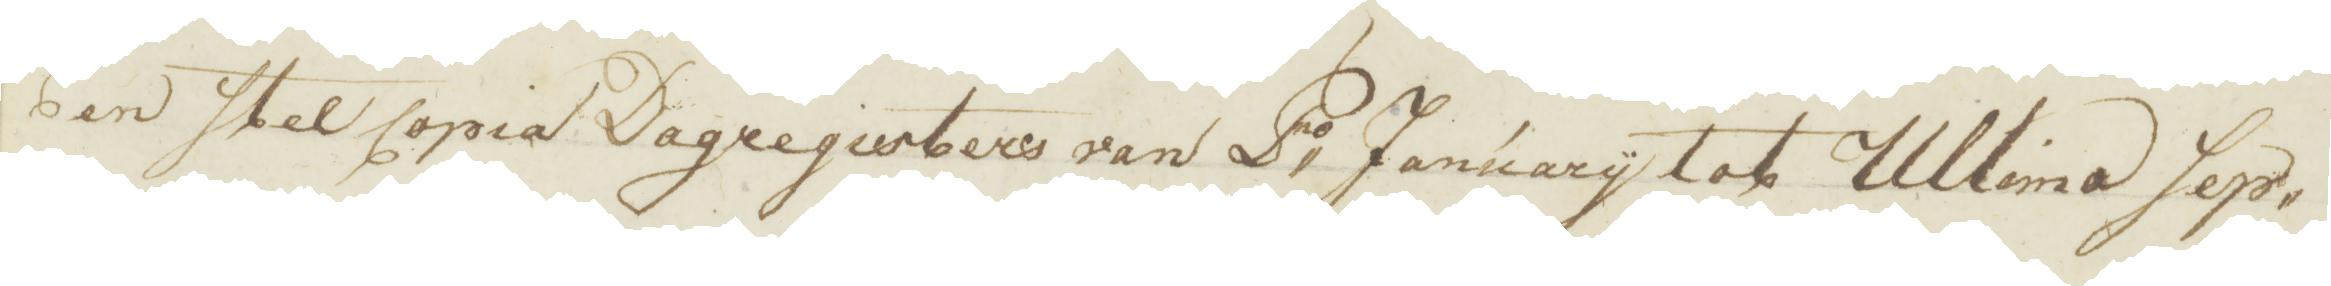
Een stel Copia Dagregisters van P„mo Januarij tot Ultimo Sep„
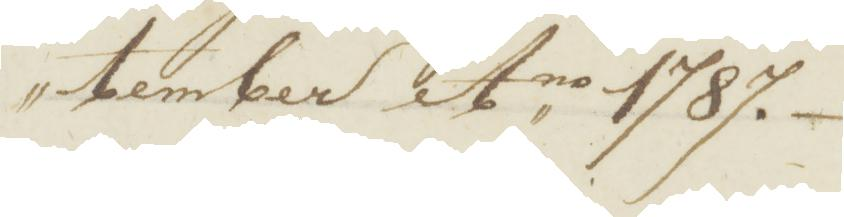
„tember A„no 1787.—
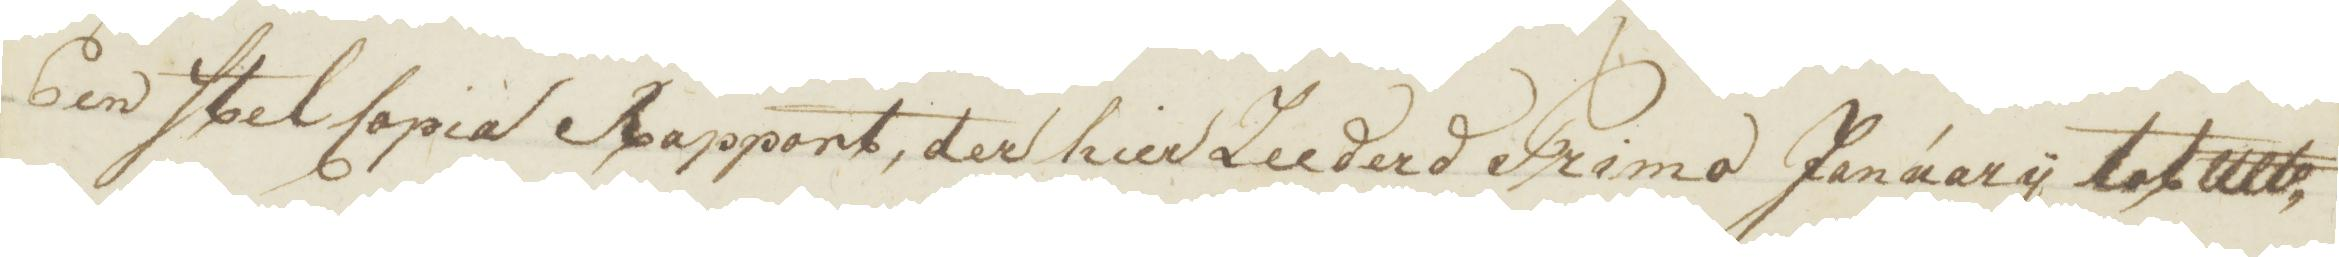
Een stel Copia Rapport, der hier Zeederd Primo Januarij tot ult„o
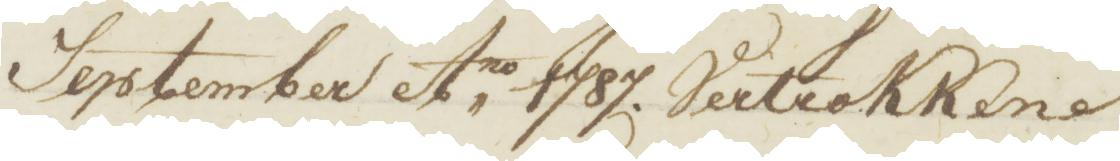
September A„no 1787. Vertrokkene
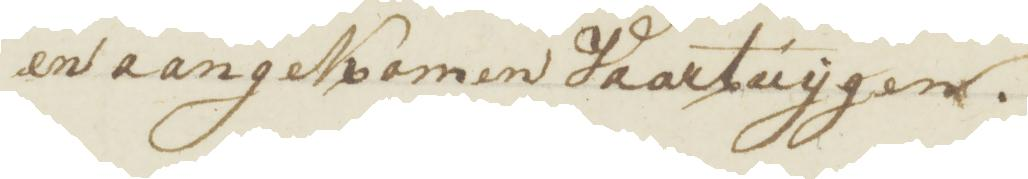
en aangekomen Vaartuijgen.
